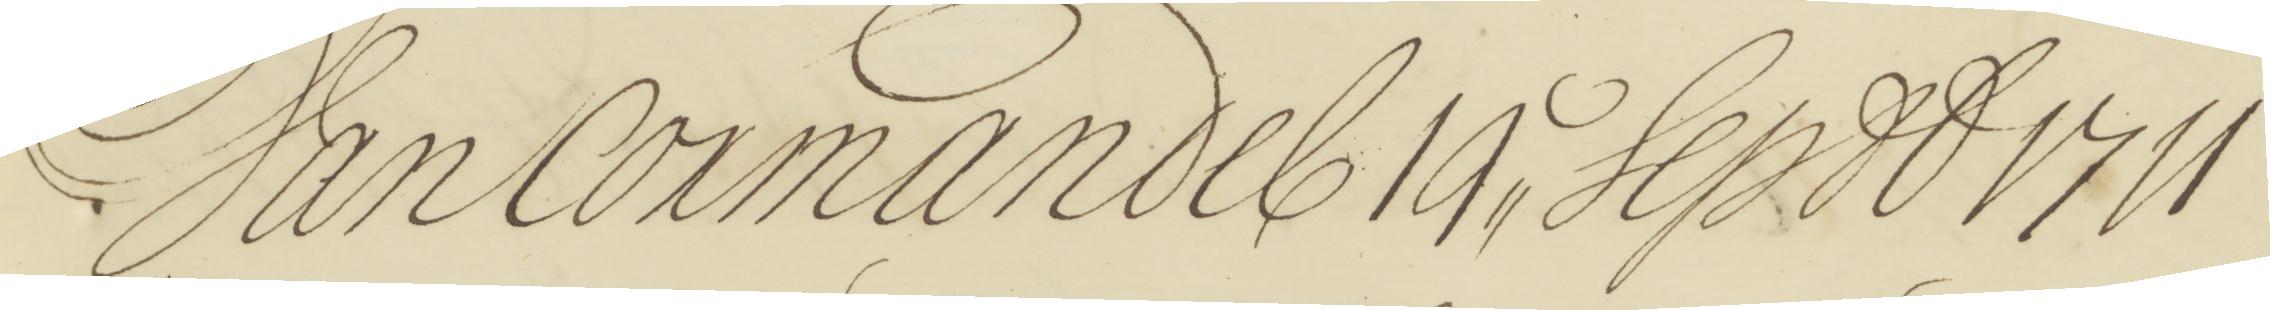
Van Cormandel 14„' Septb 1711
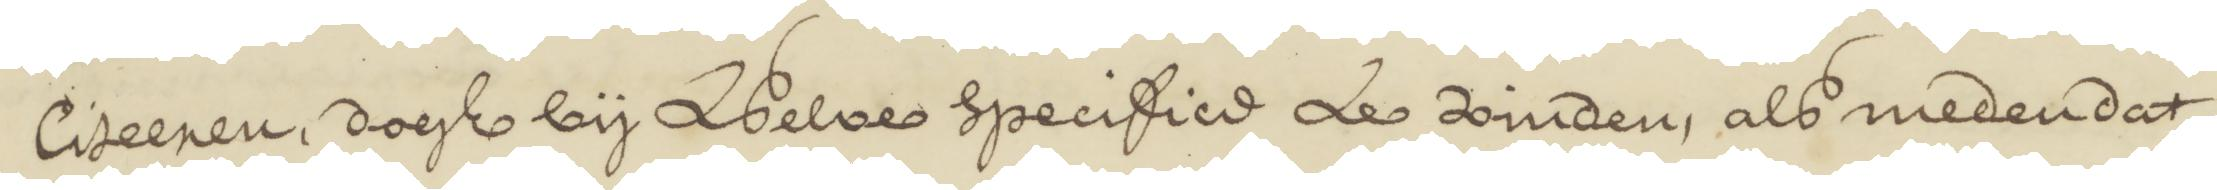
liseeren, dogh bij t selve specifice te vinden, als meden dat
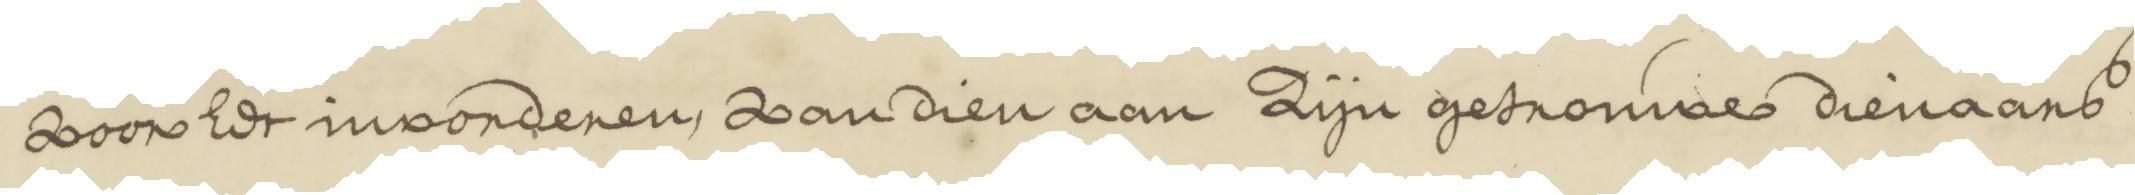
voor het invorderen, van dien aan Zijn getrouwe dienaars
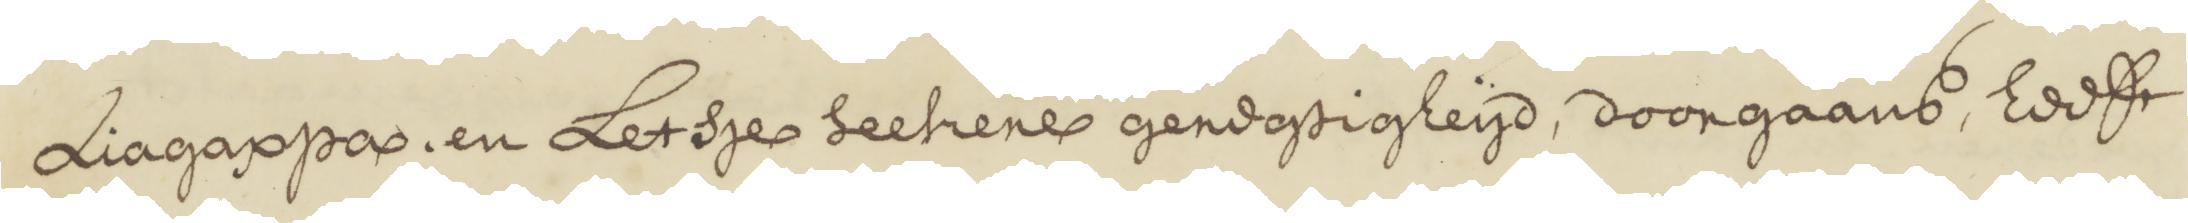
Tiagappa, en Letsje seekere geregtigheijd, doorgaans, heeft
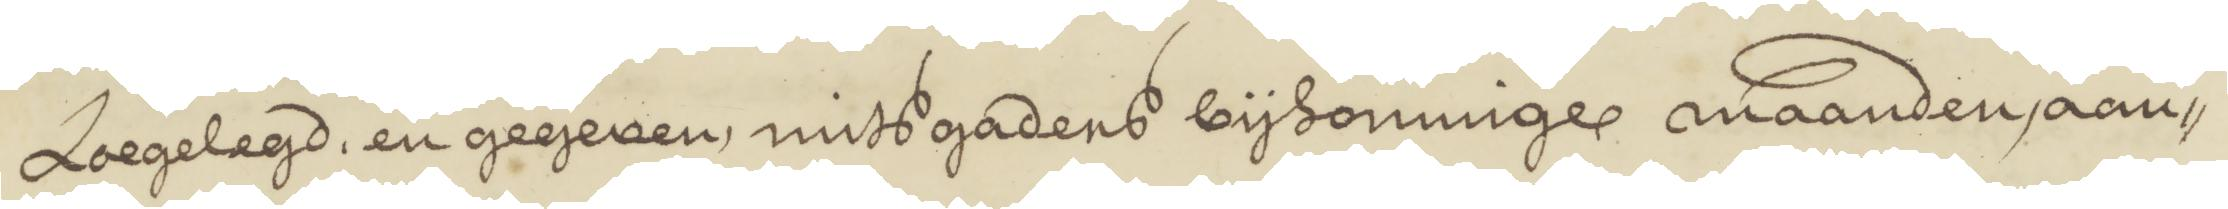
Toegelegd, en gegeven, mitsgaders bijsonmige maanden, aan„
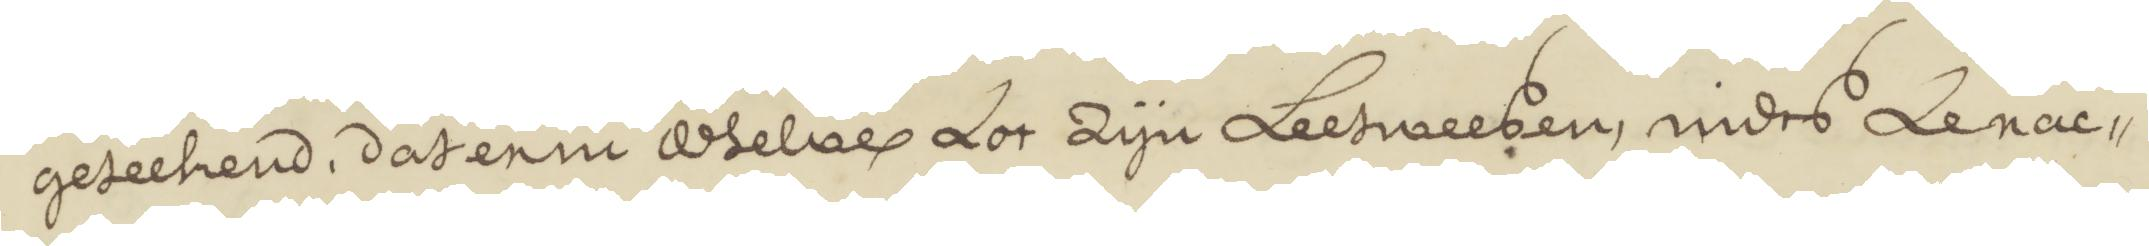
geteekend, dat er in deselve tot zijn Leetweesen, niets te rac„
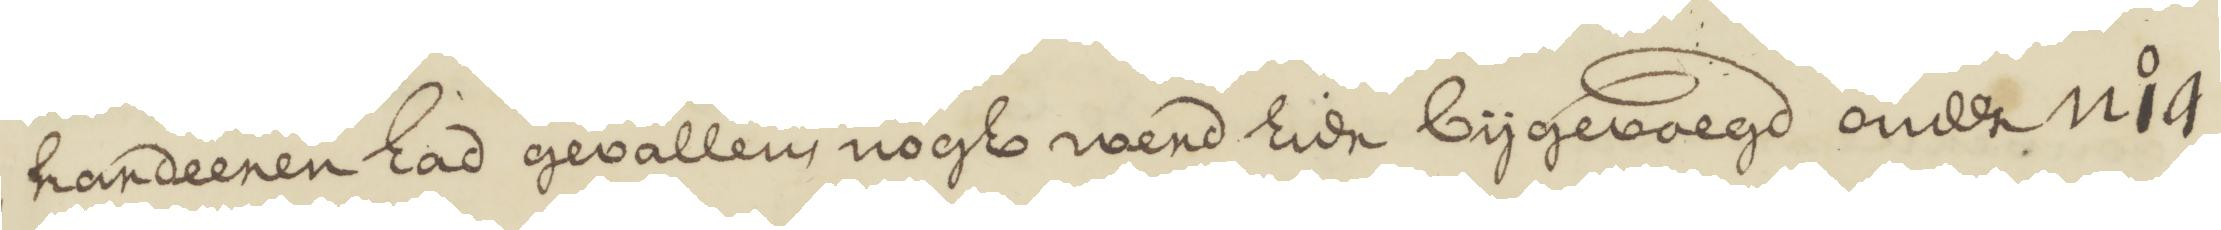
kardeeren had gevallen nogh werd hier bij gevoegd onder n:o 14
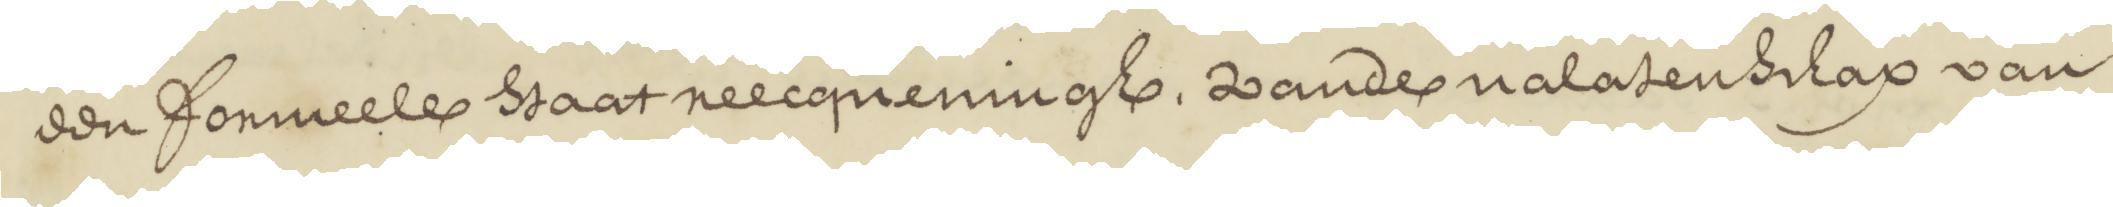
een formeele staat reecqueningh, vande nalatenschap van
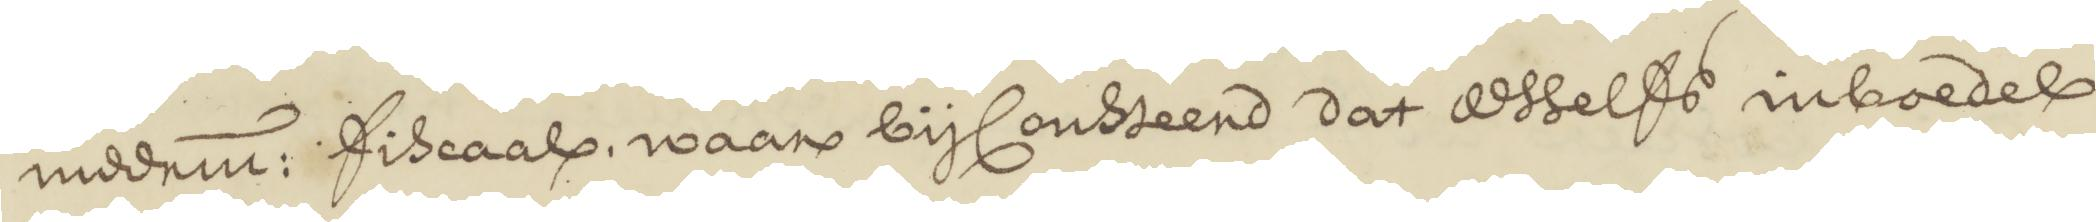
meerm: fiscaal, waar bij Consteerd dat desselfs inboedel
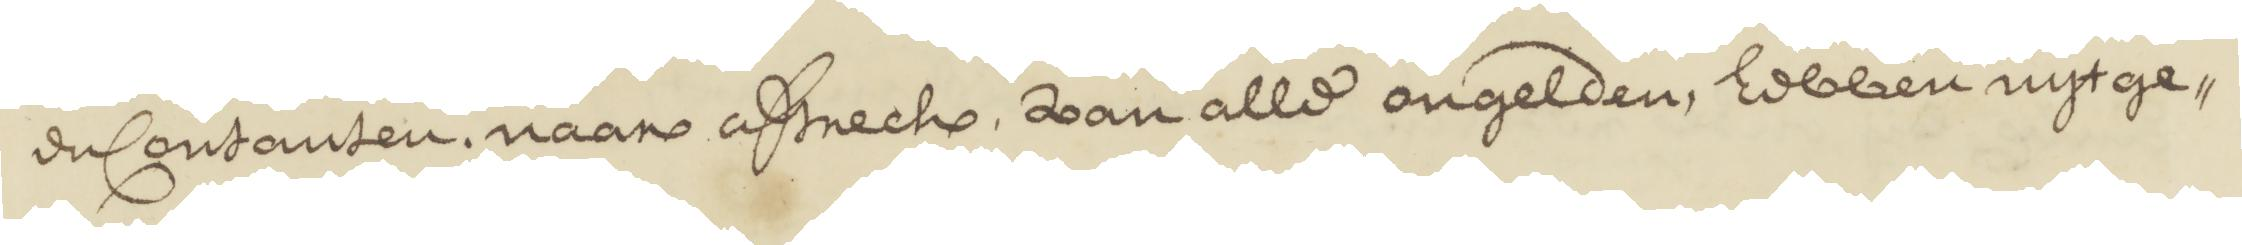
en Contanten, naar aftreck, van alle ongelden, hebben uijtge„
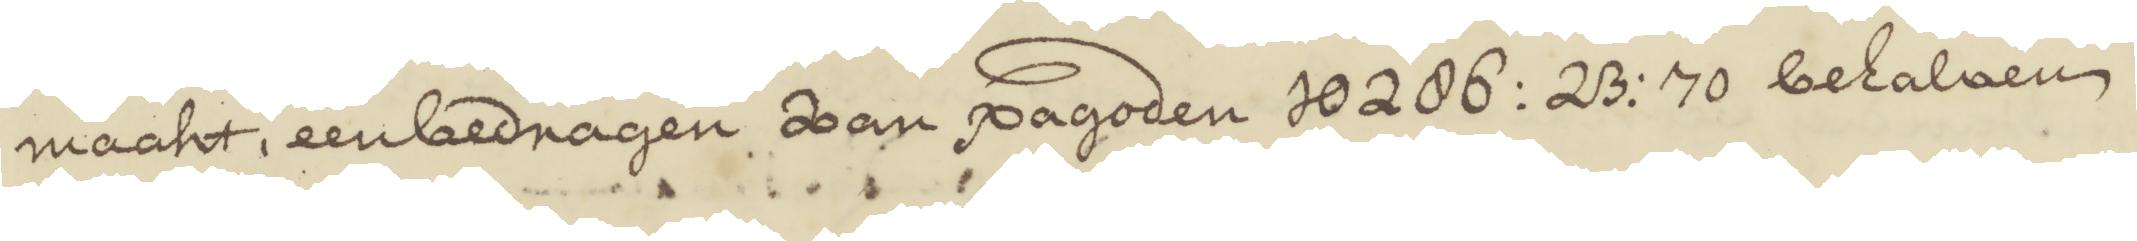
maakt, een bedragen van pagoden 10286:23:70 behalven
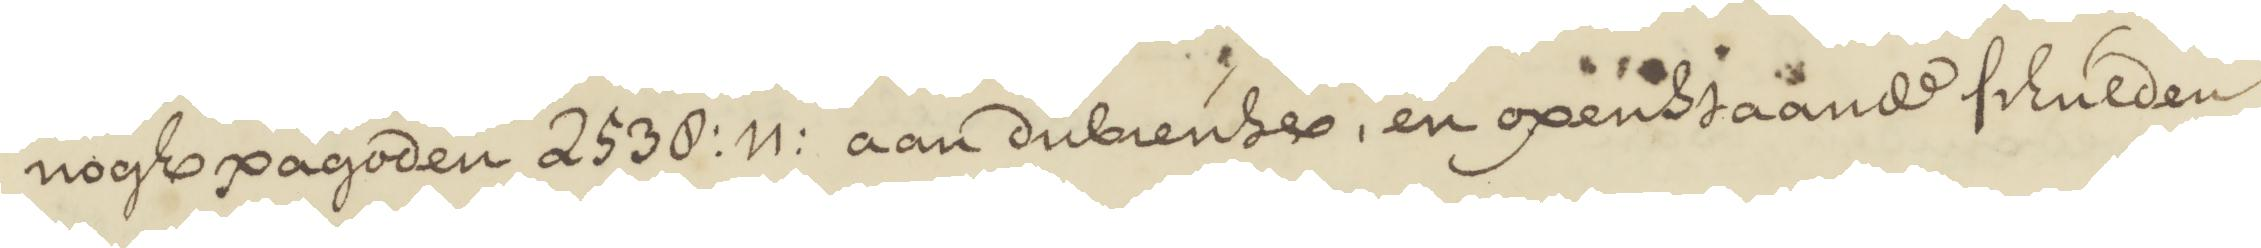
nogh pagoden 2538:11: aan dubieuse, en openstaande schulden
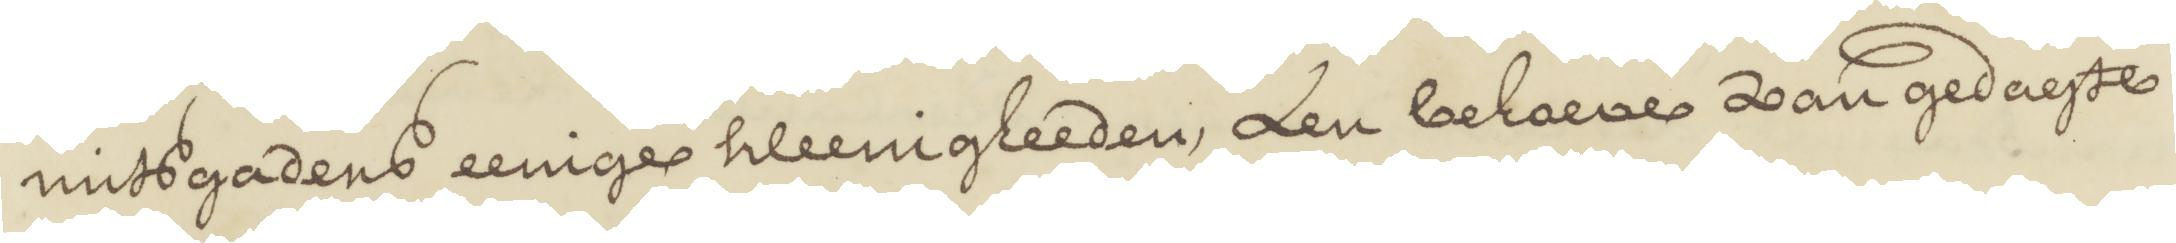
mitsgaders eenige kleenigheeden, ten behoeve van gedagte
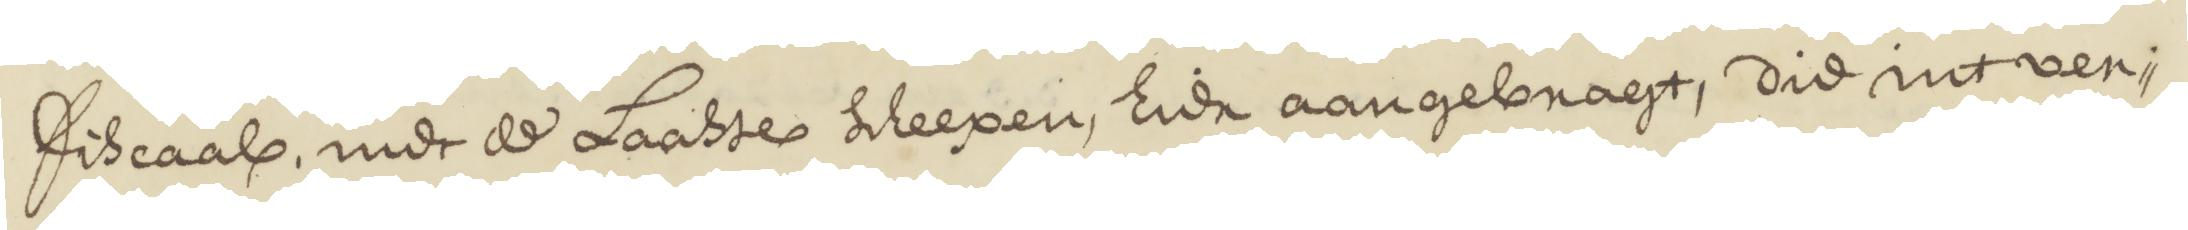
fiscaal, met de laaste scheepen, hier aangebragt, die int ver„
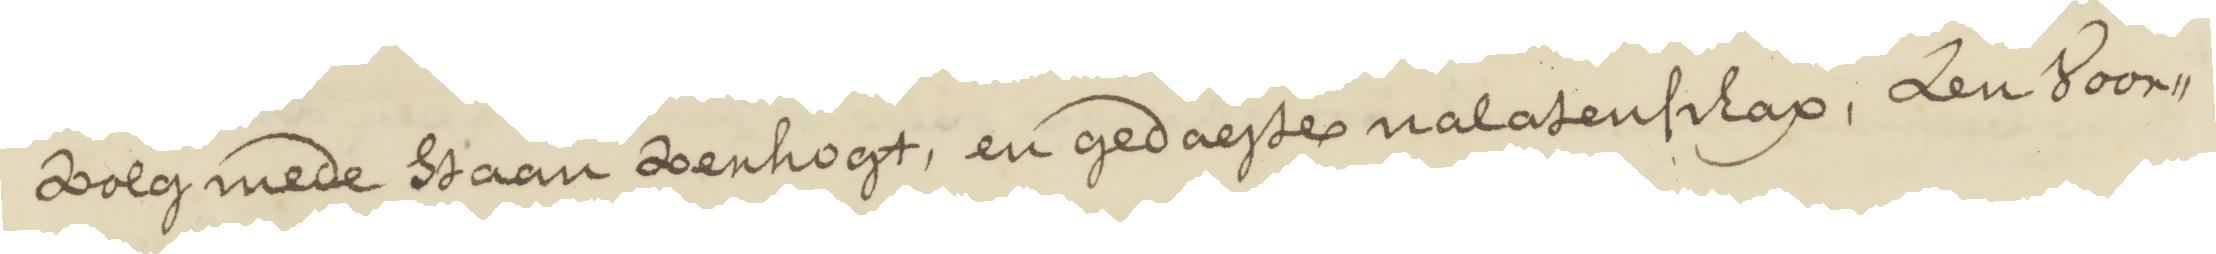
volg mede staan verkogt, en gedagte nalatenschap, ten voor„
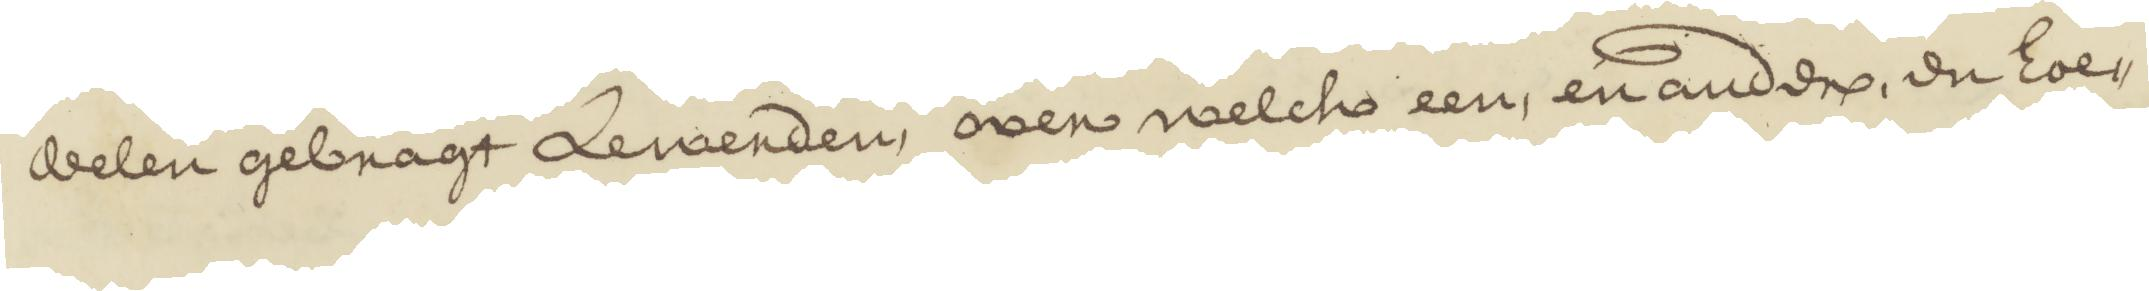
deelen gebragt te werden, over welck een, en ander, en hoe„
